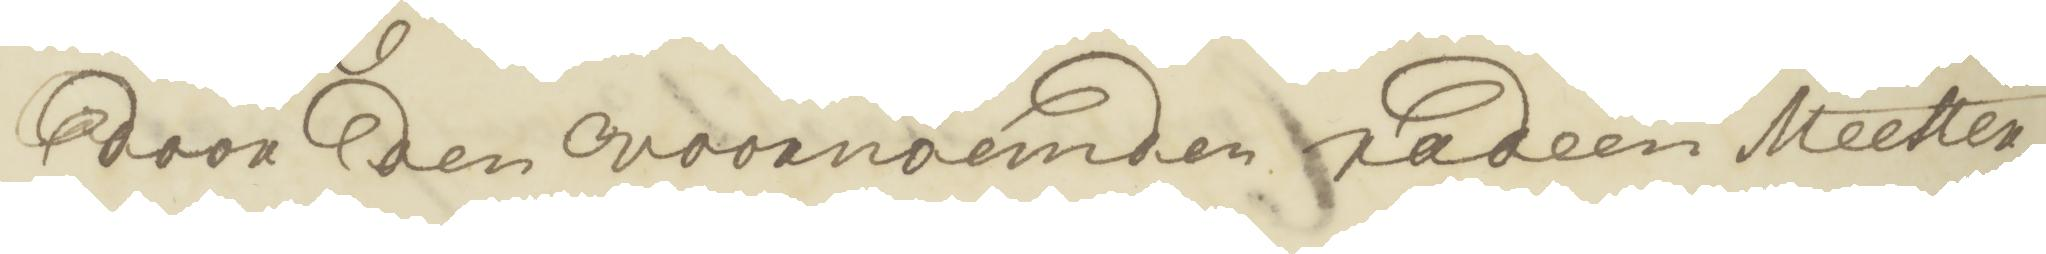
door den voornoemden radeen Meester
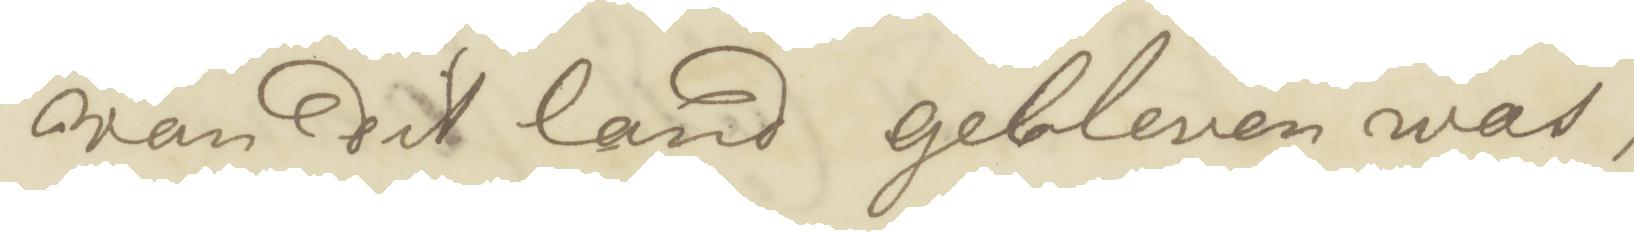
van dit land gebleven was
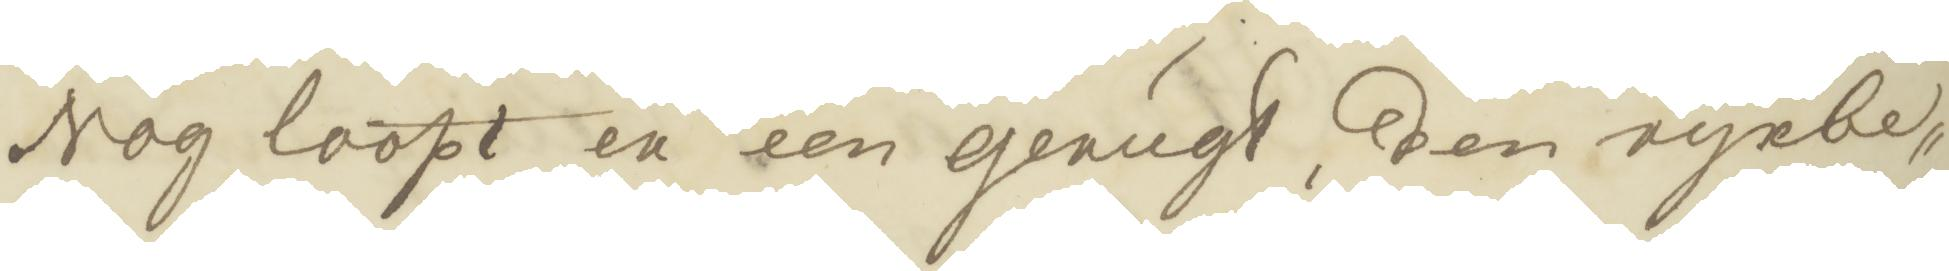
Nog loopt en een gerugt, den rijxbe„
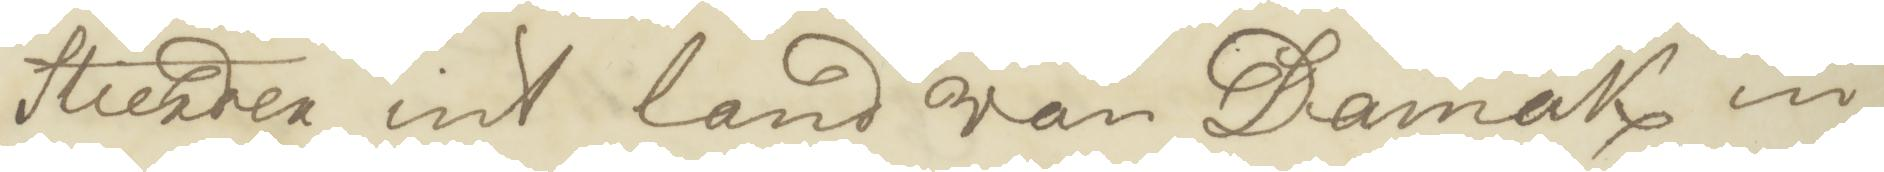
stierder in't land van Damak in
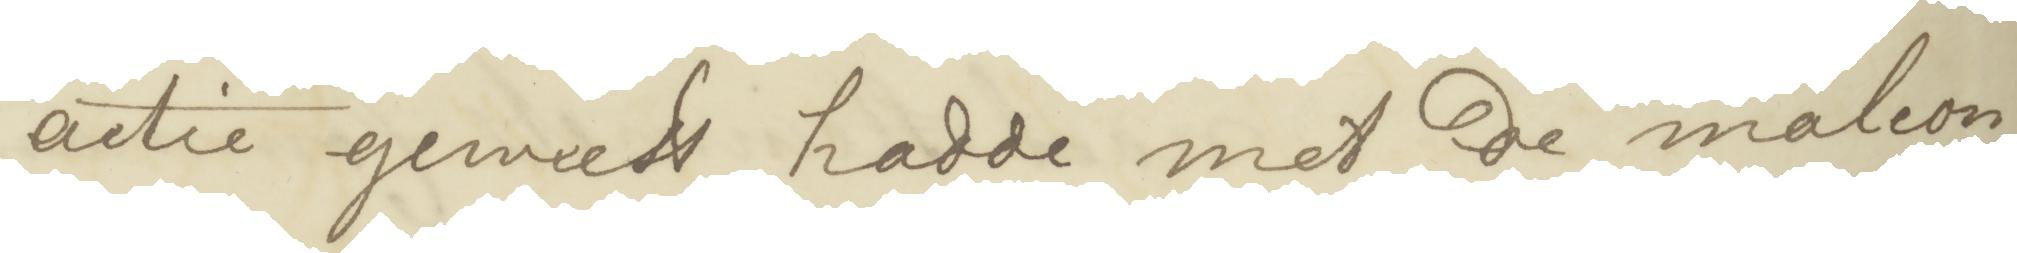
actie geweest hadde met de maleon
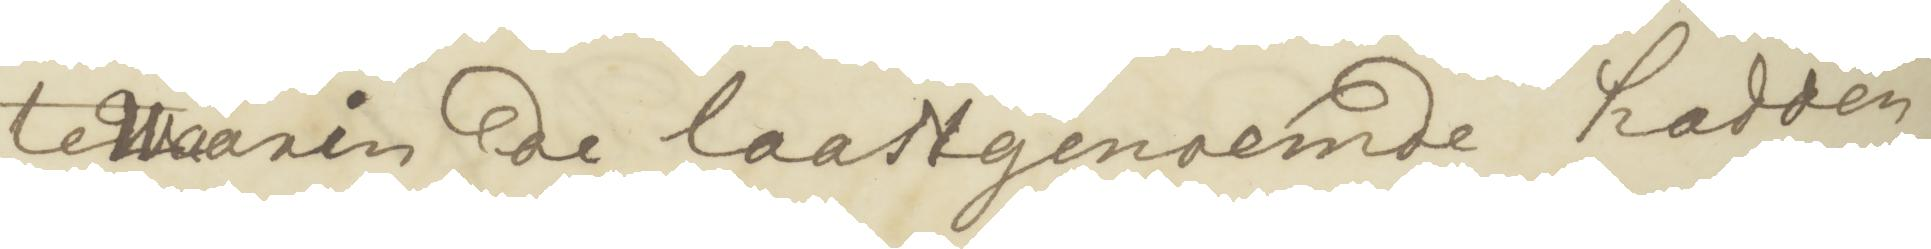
te waarin de laastgenoemde hadden
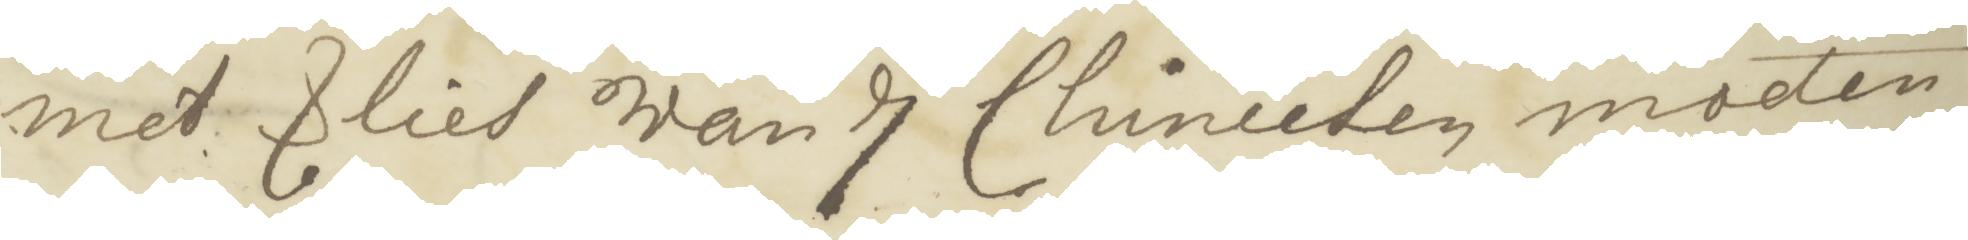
met verlies van 7 Chineesen moeten
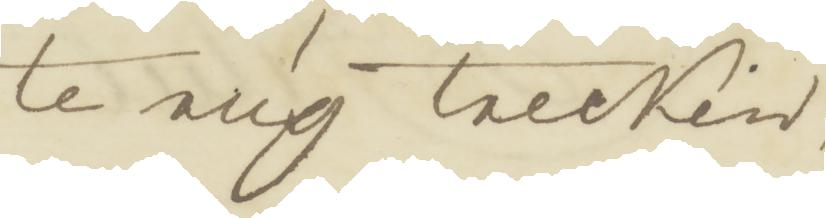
te rug trecken
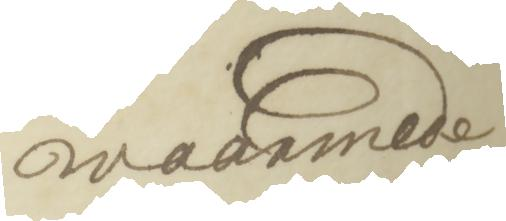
waarmede
